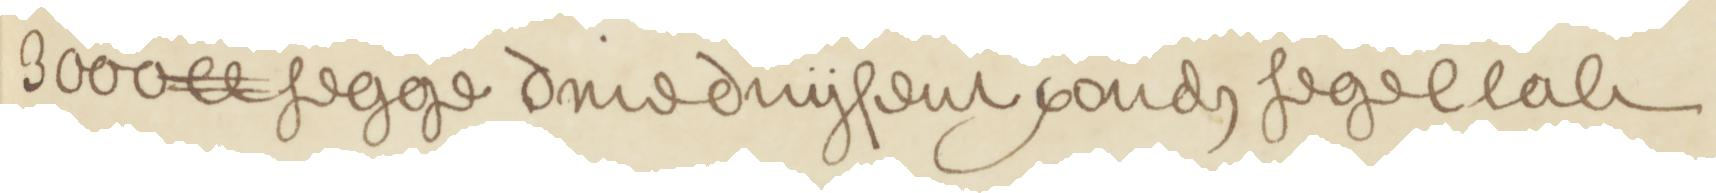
3000 lb segge drieduijsent ponden segellak
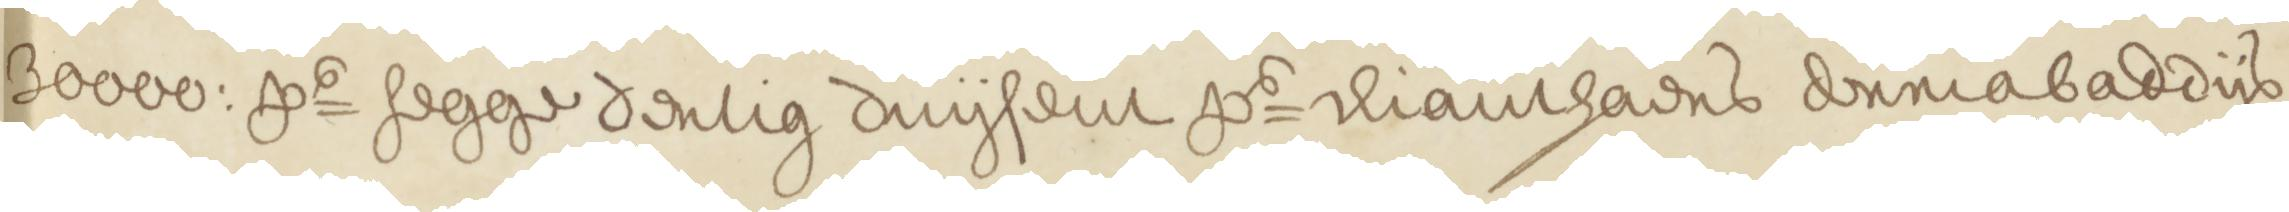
30000: p=s segge dertig duijsent p=s eiauthaers derriabaddijs
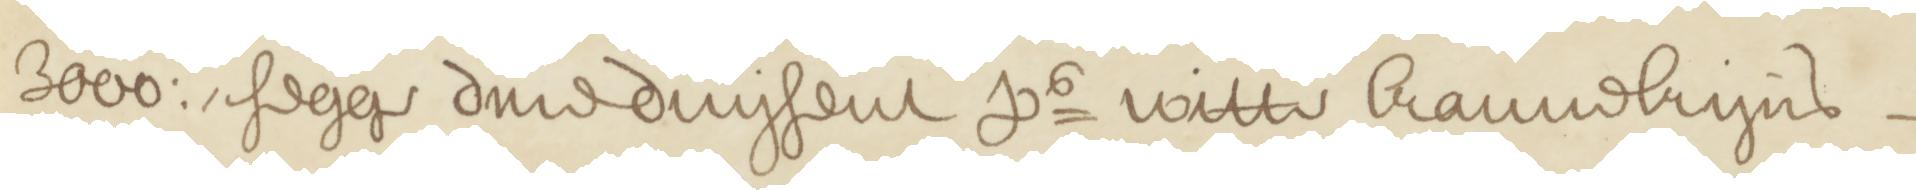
3000: „ segge drieduijsent p=s witte kannekijns —
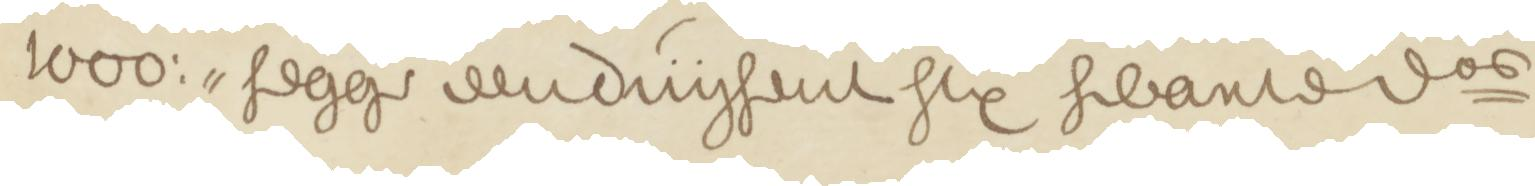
1000: „ segge eenduijsent stx swarte d=os
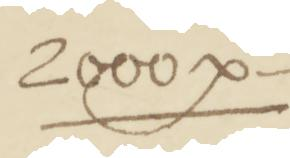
2000 p-s
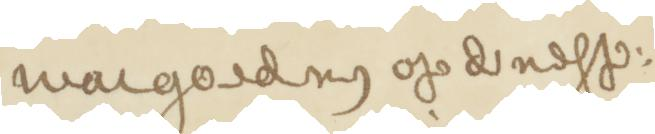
watgoederen op de resp:
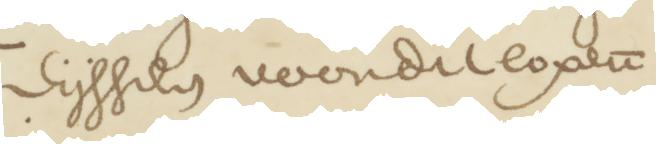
Eijsschen voordit lopen
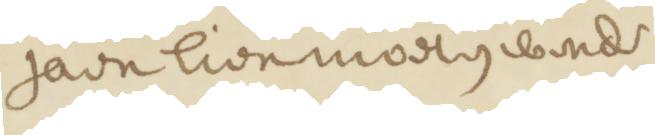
jaer hier moeten werde
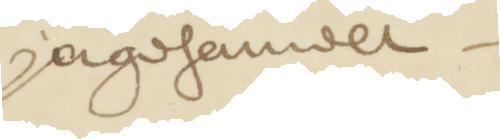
jngesamelt —
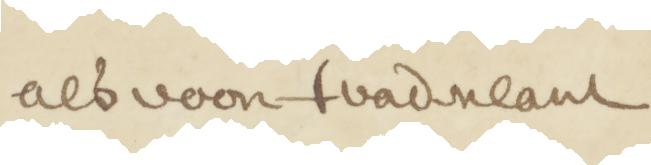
als voor 't vaderlant
